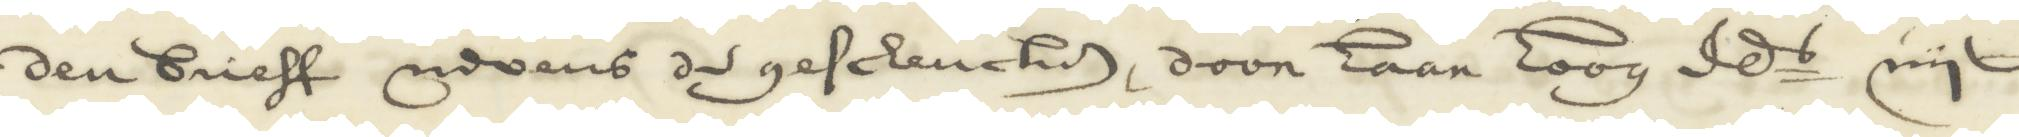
den brieff nevens de geschencken, door haar hoog Ed=s uijt
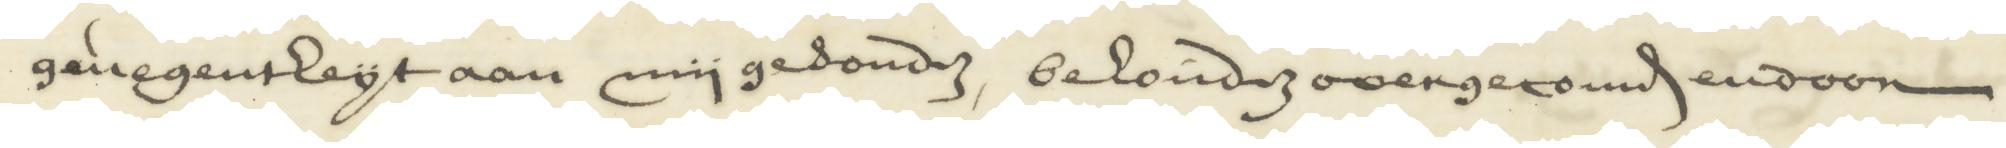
genegentheijt aan mij gesonden, behouden overgecomen endoor
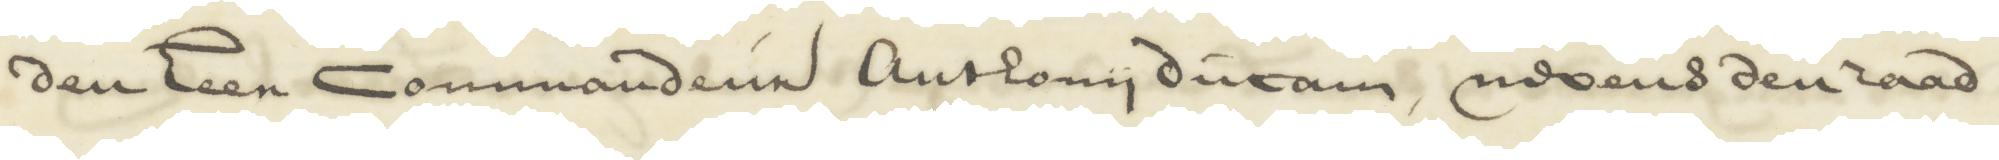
den heer commandeur Anthonij ducam, nevens den raad
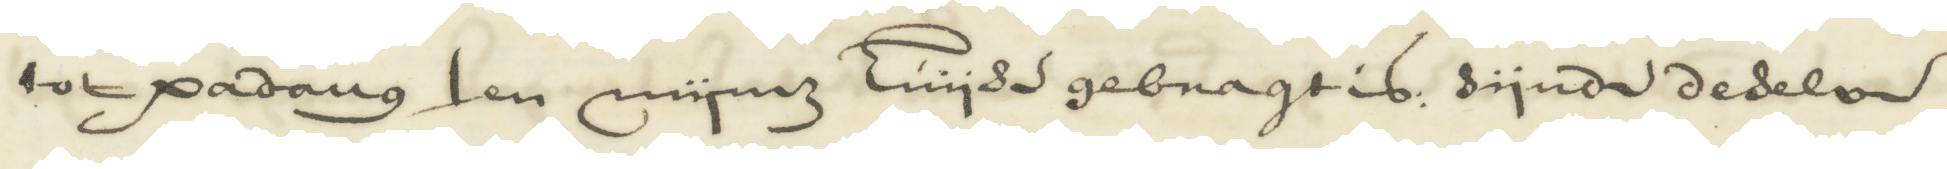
tot padang ten mijnen huijse gebragt is, sijnde deselve
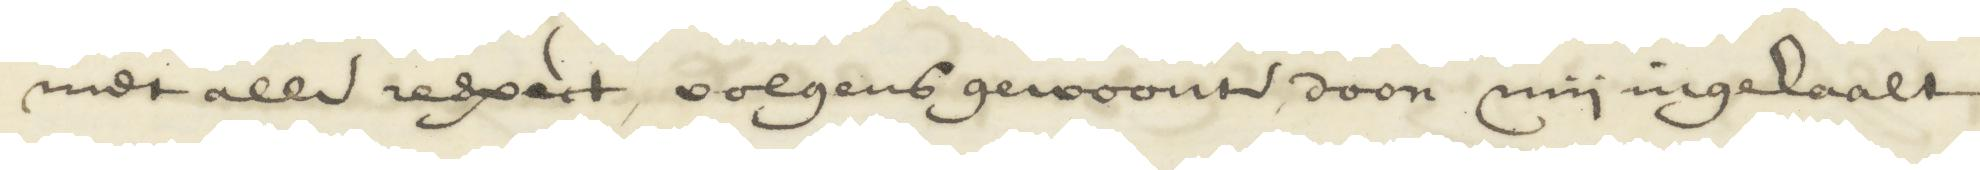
met alle respect, volgens gewoonte, door mij ingehaalt
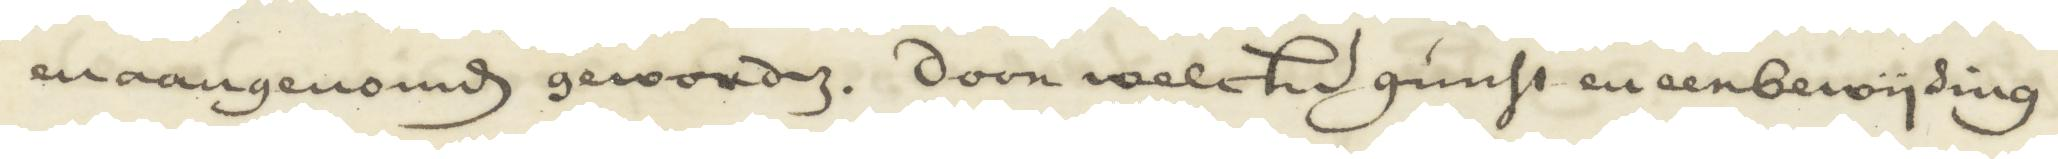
en aangenomen geworden. door welcke gunst en eerbewijsing
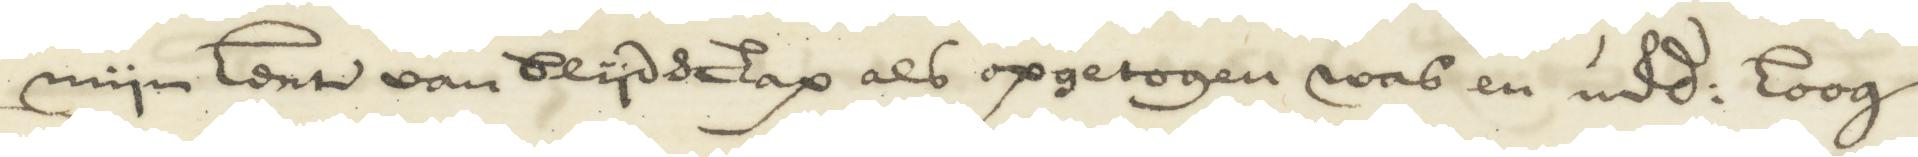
mijn herte van blijdschap als opgetogen was en uEd: hoog
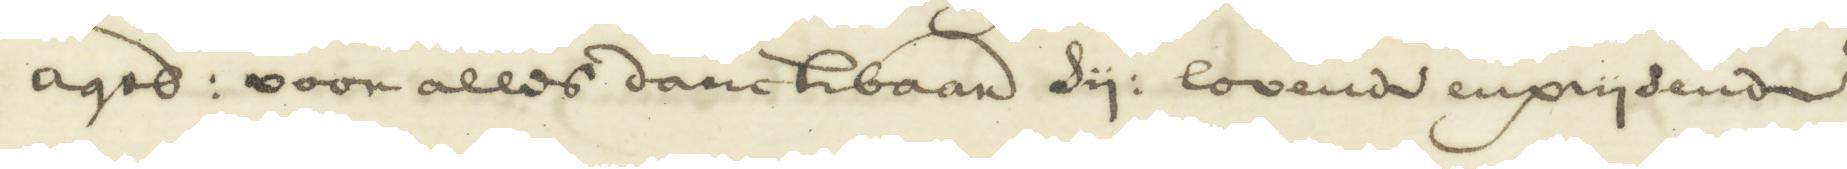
agtb: voor alles danckbaar sij: lovende enprijsende
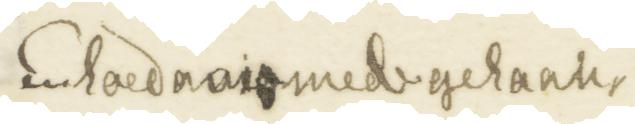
en hoedanig mede gehaak„
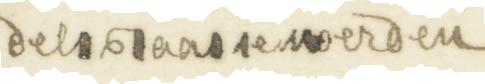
delt staat te werden
